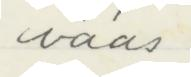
vaas
